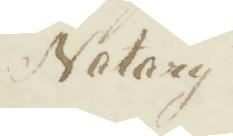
Notary
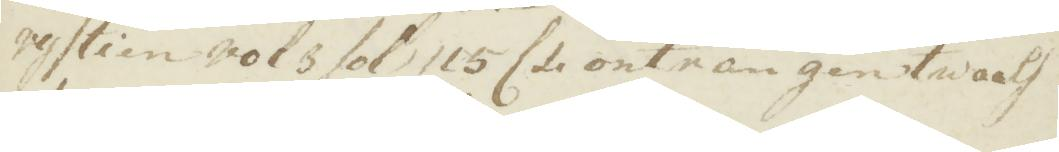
vyftien vol 3 fol 115 Ct ontvangen twaalf
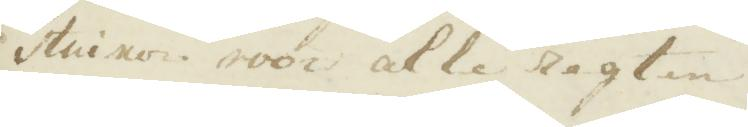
stuivers voor alle regten
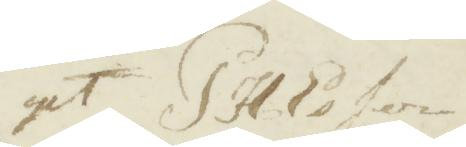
get PHEsseren
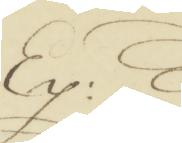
Ey:
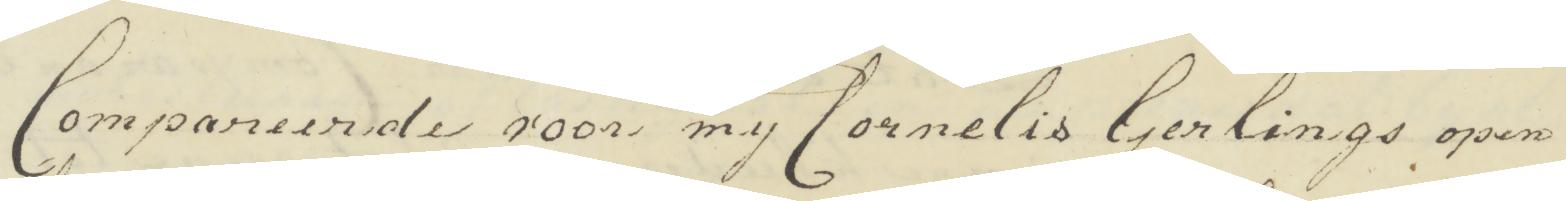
Compareerde voor my Cornelis Gerlings open
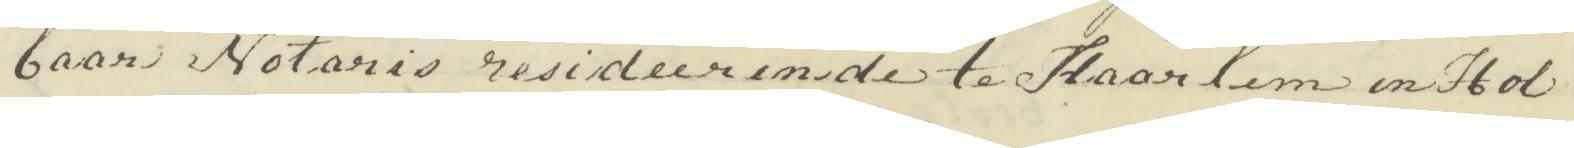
baar Notaris resideerende te Haarlem in Hol
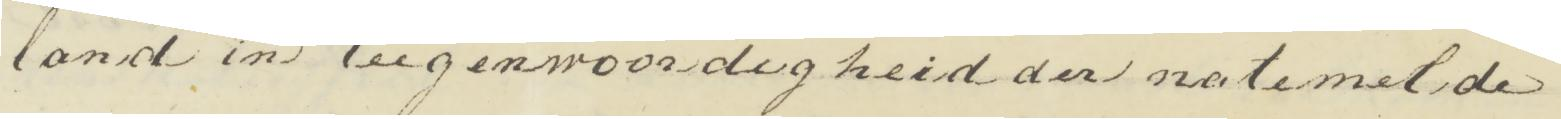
land in teegenwoordigheid der natemelde
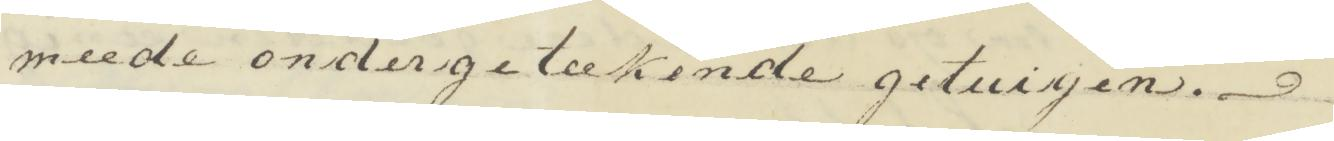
meede ondergeteekende getuigen.—
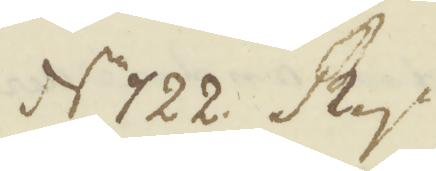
N 122. Ry
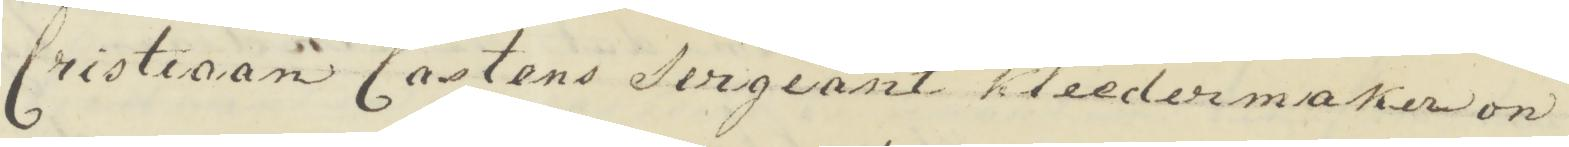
Cristiaan Castens sergeant kleedermaker on
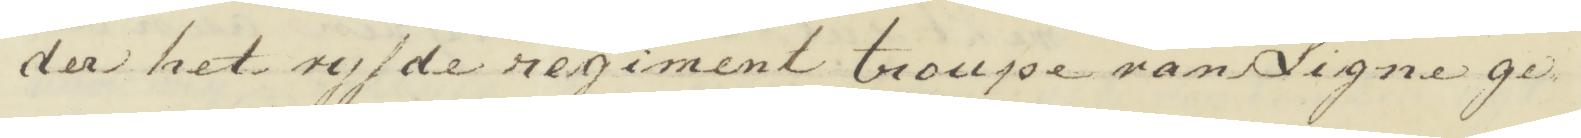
der het vyfde regiment troupe van signe ge„
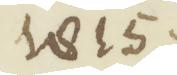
1815
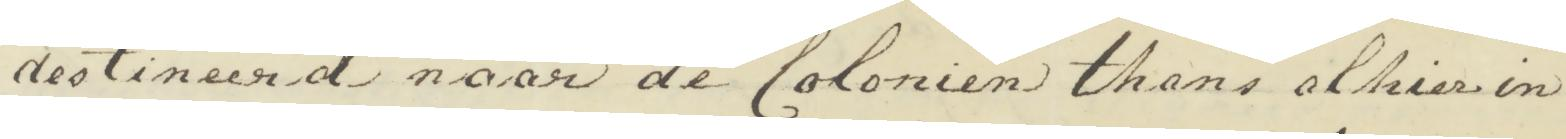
destineerd naar de Colonien thans alhier in
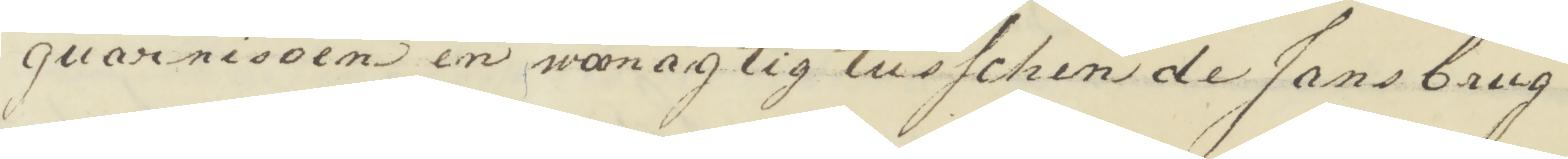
guarnisoen en woonagtig tusschen de Jansbrug
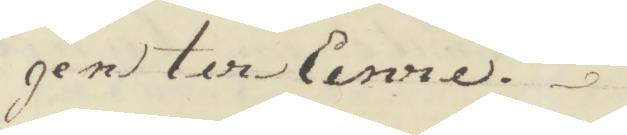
gen ter Eenre.-
